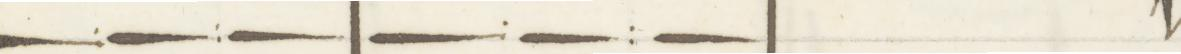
—:—:— —:—:— 1
